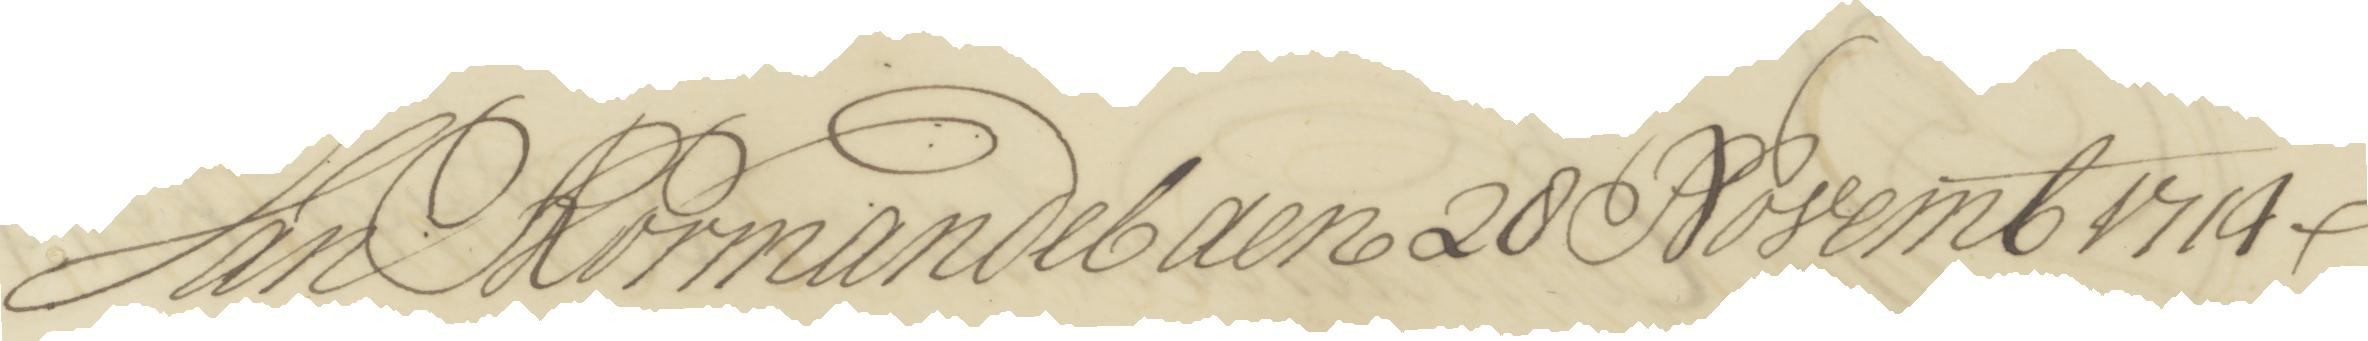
Van Kormandel den 28 Novemb 1714 —
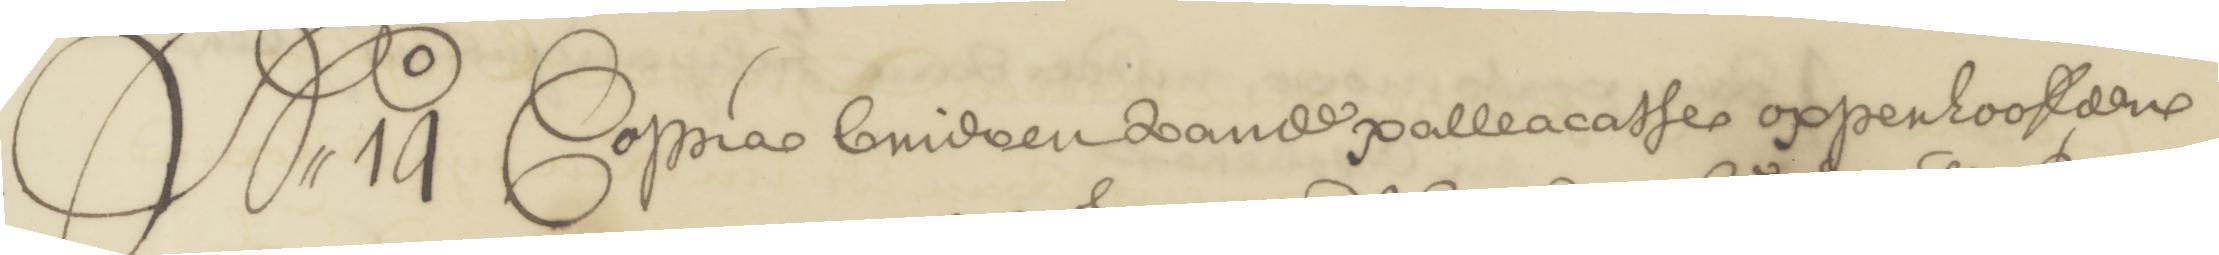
N„o 14 Copia brieven vande palleacatse opperhoofden
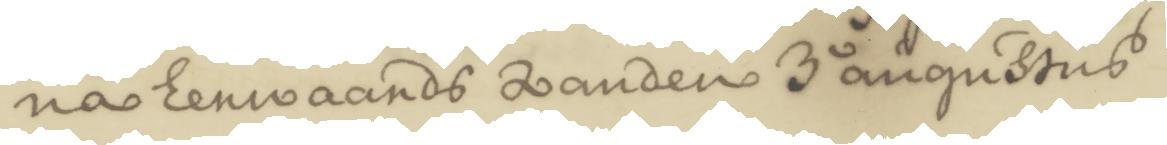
na herwaards vanden 3e augustus
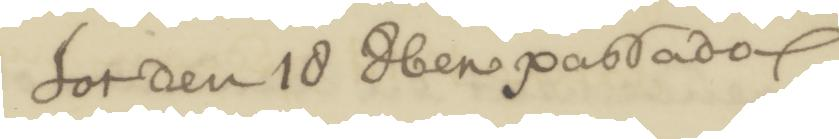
tot den 18 8ber passado —
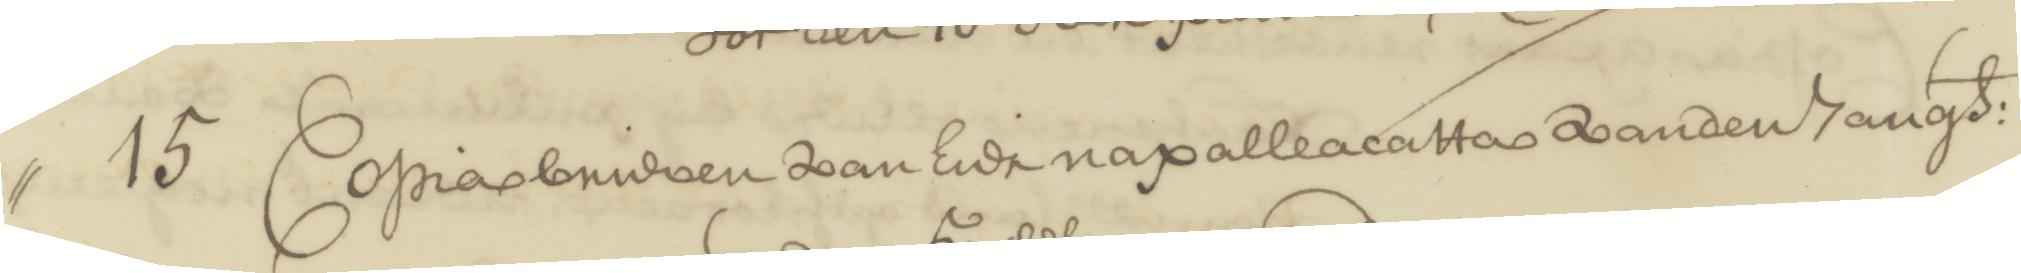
„ 15 Copia brieven van hier na palleacatta vanden 7 augs:
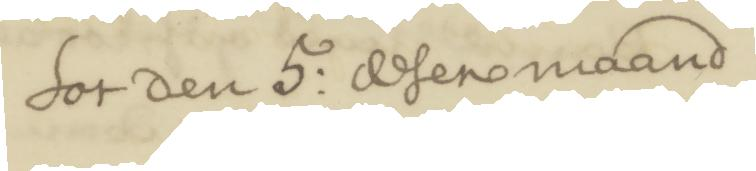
tot den 5: deser maand
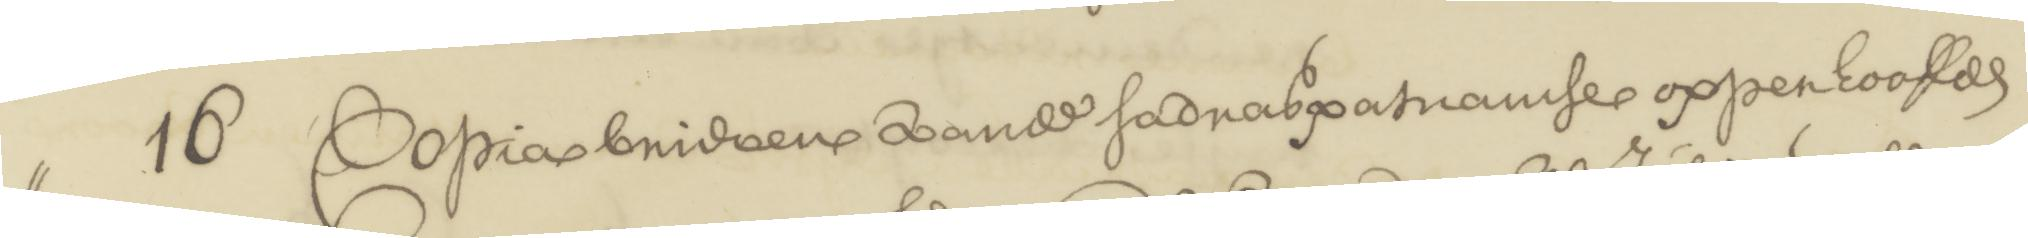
„ 16 Copia brieven vande sadraspatnamse opperhoofden
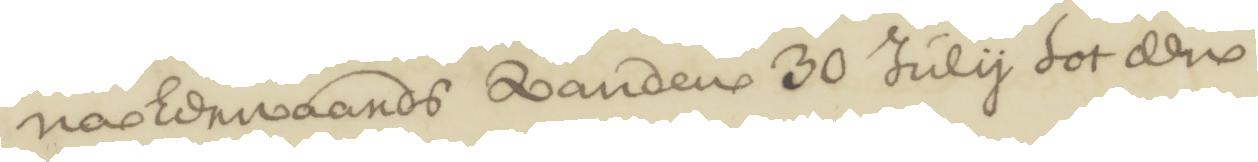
na herwaards vanden 30 Iulij tot den
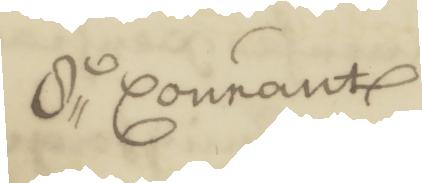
8„e Courant
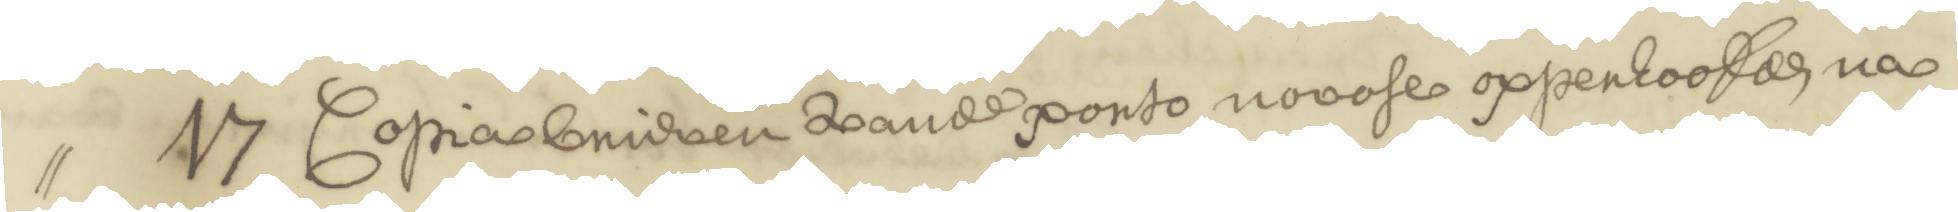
„ 17 Copia brieven vande porto novose opperhoofden na
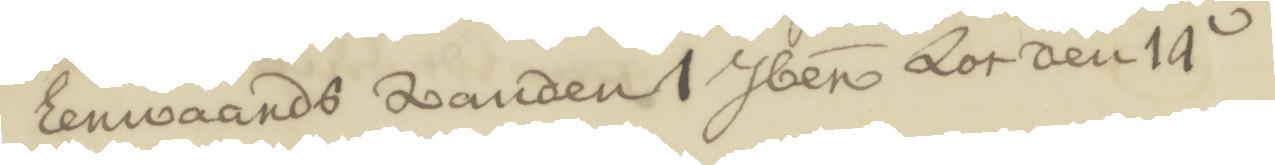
herwaards vanden 1 7ber tot den 14e
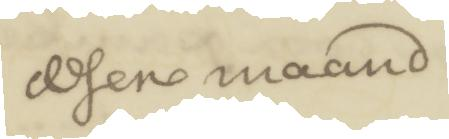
deser maand
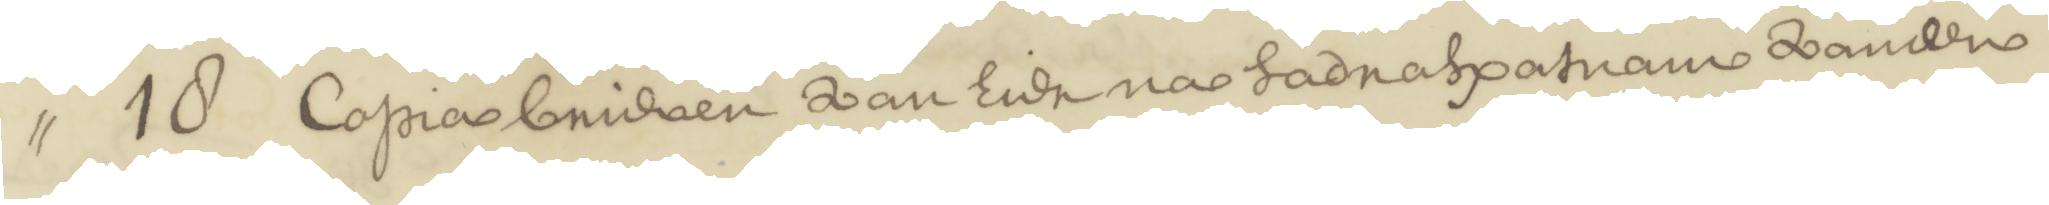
„ 18 Copia brieven van hier na sadraspatnam vanden
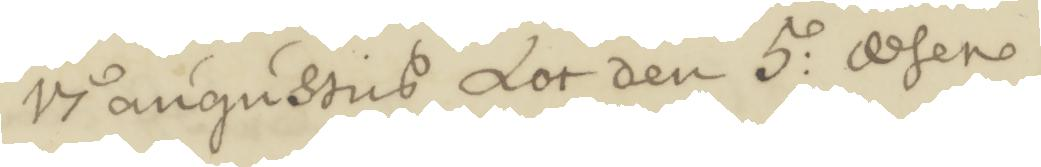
17e augustus tot den 5: deser
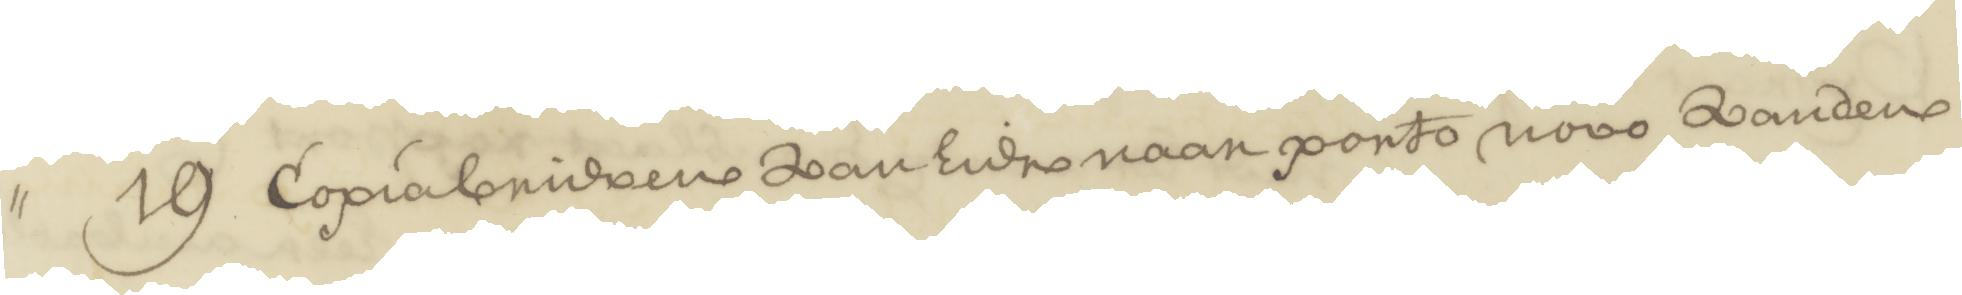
„ 19 Copia brieven van hier naar porto novo vanden
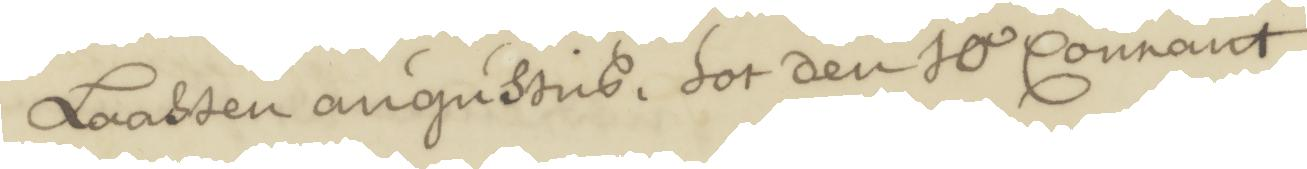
Laasten augustus, tot den 10e Courant
